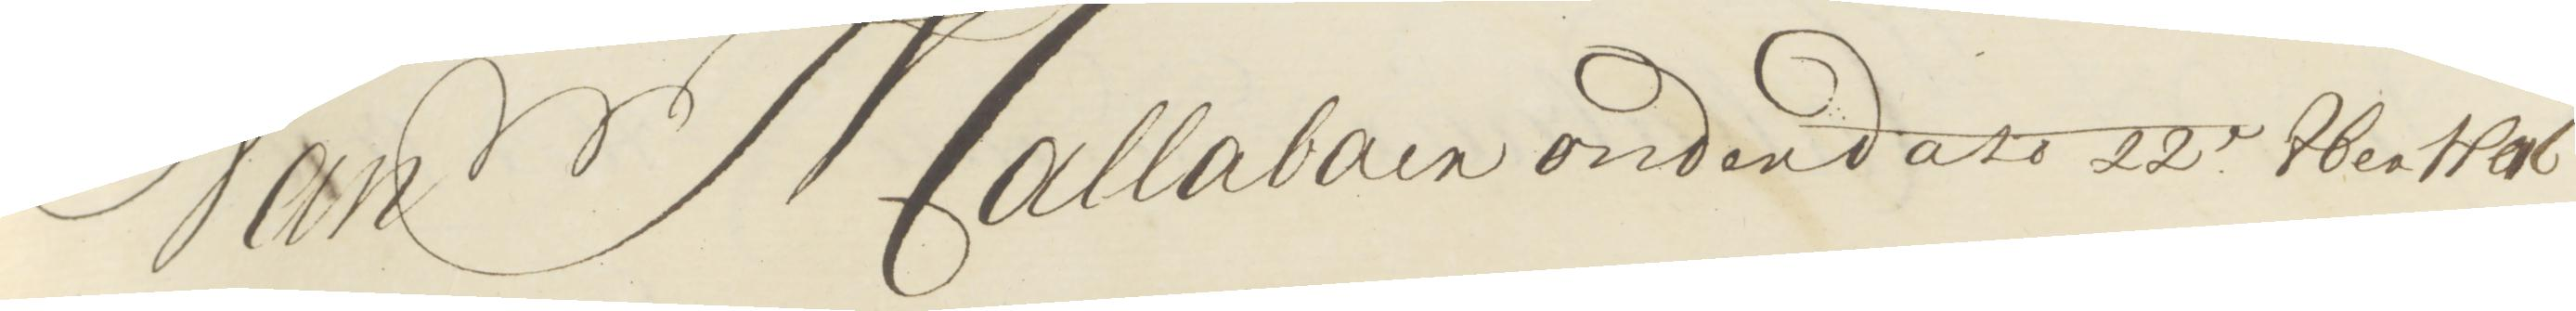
Van Mallabaer onder dato 22' 8ber 1746
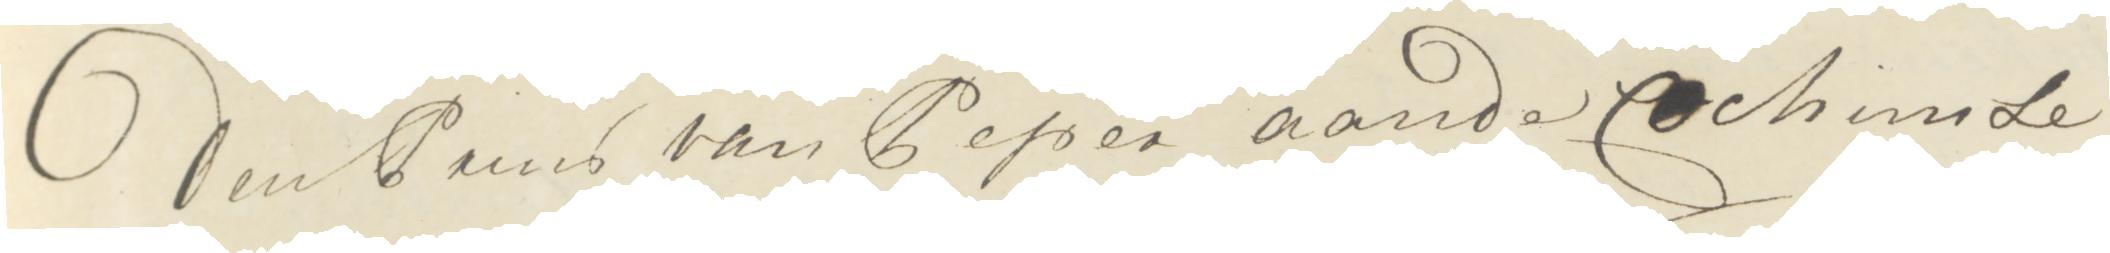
den Prins van Peper aande Cochimse
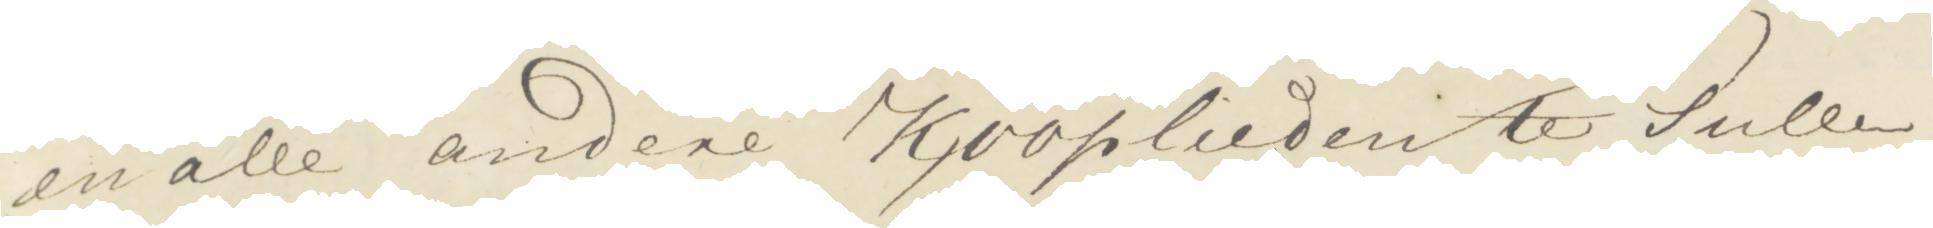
en alle andere Kooplieden te sulle
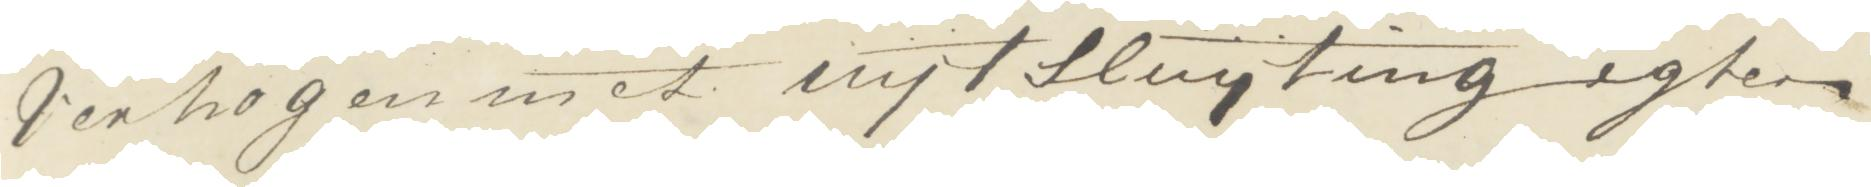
verhogen met uijtsluijting egter
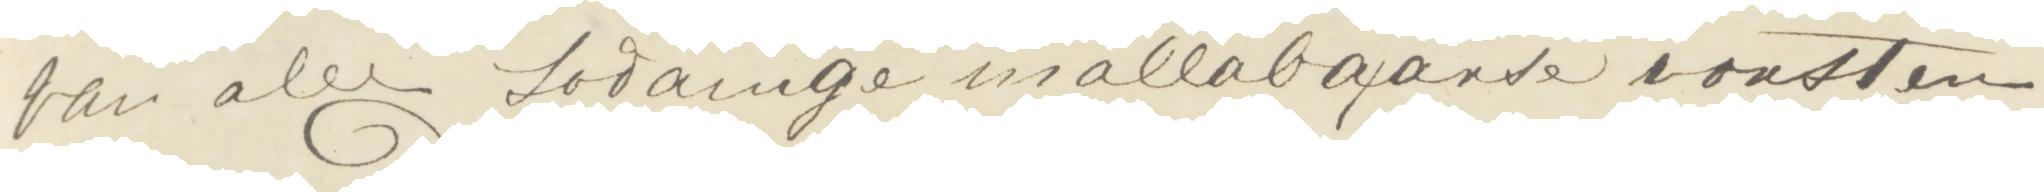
van alle sodanige mallabaarse vorsten
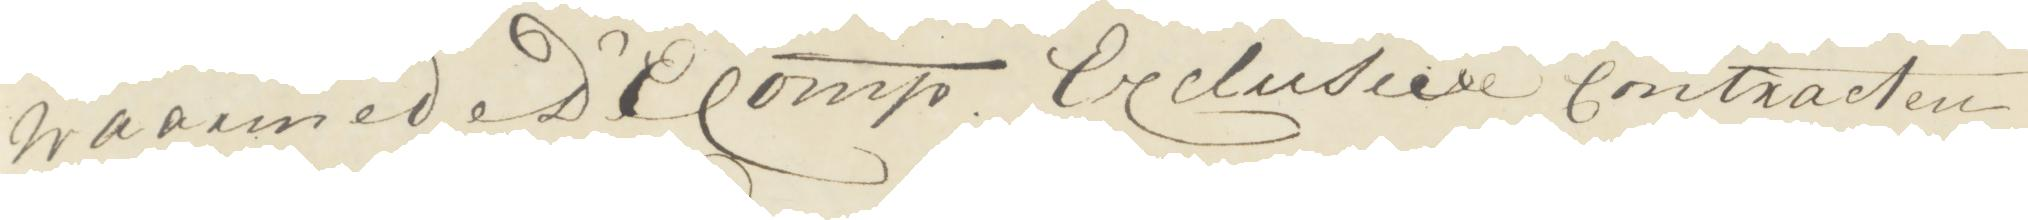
waarmede D' E Comp. Exclusieve Contracten
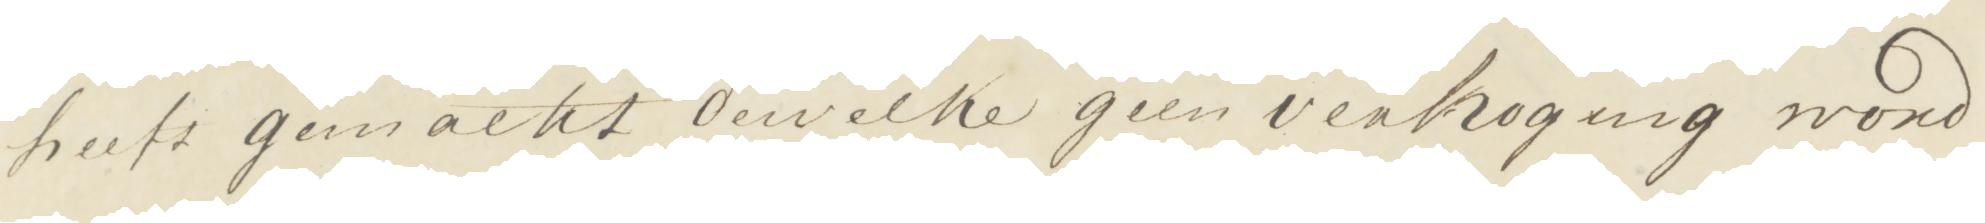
heeft gemaekt dewelke geen verhoging word
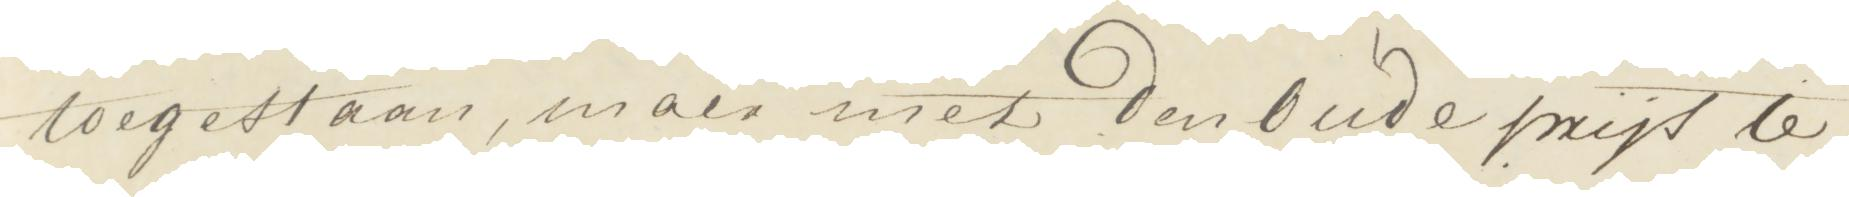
toegestaan, maer met den oude prijs te
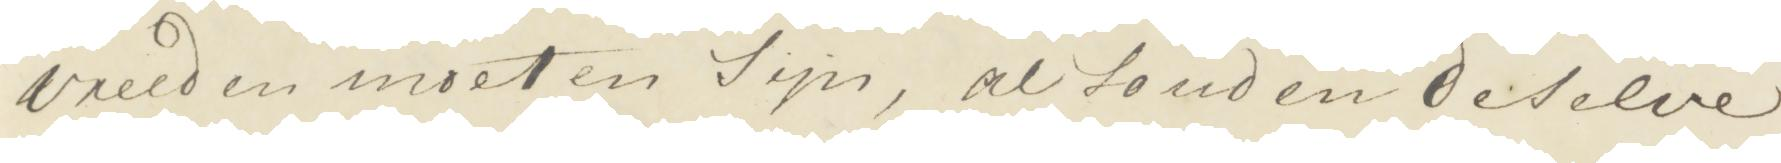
vreeden moeten sijn, al souden deselve
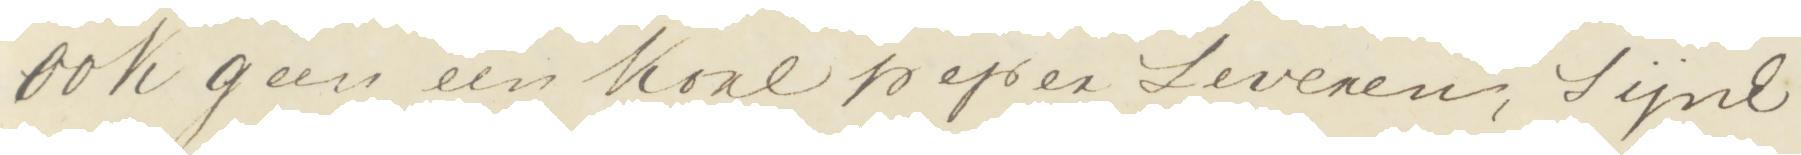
ook geen een korl peper leveren, sijne
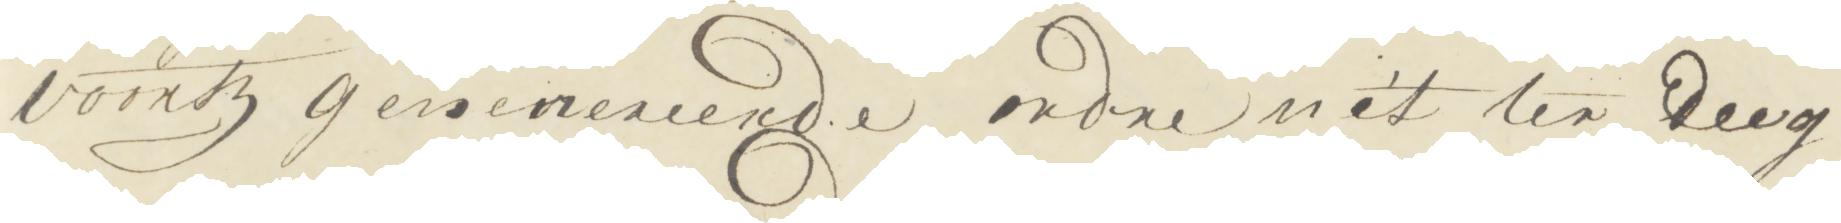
voorsz genenereerde ordre niet ter deeg
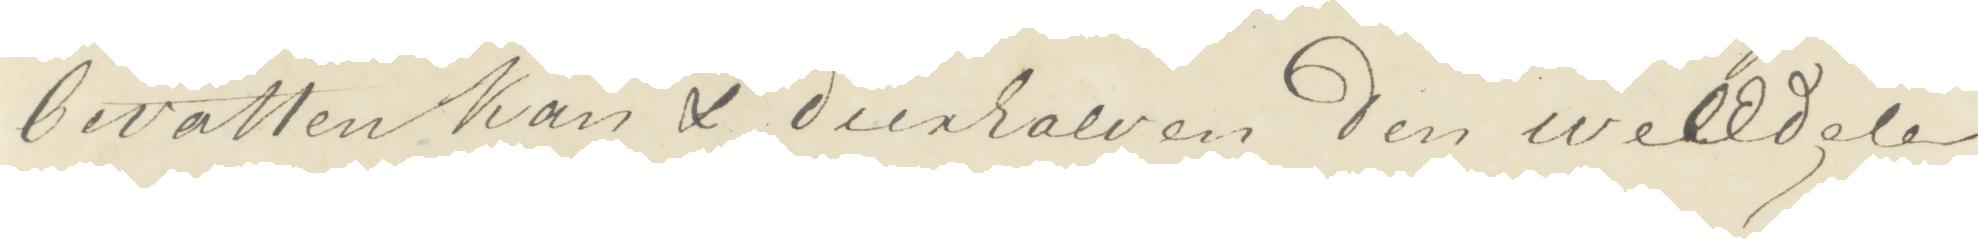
bevatten kan & dierhalven den welEdele
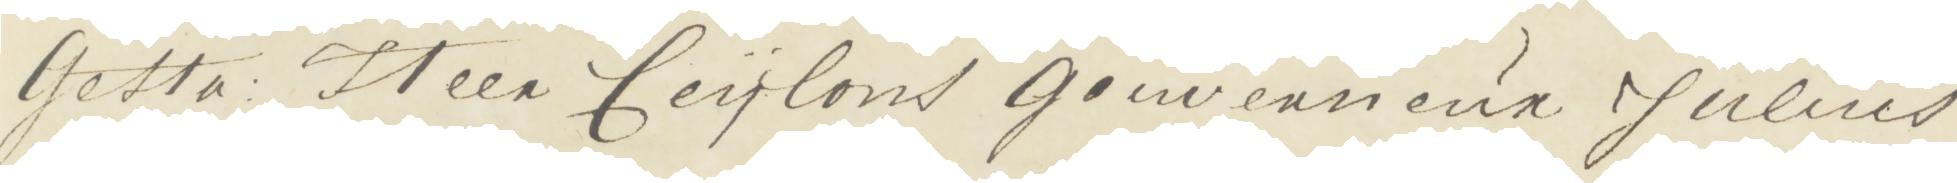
Gestr: Heer Ceijlons gouverneur Julius
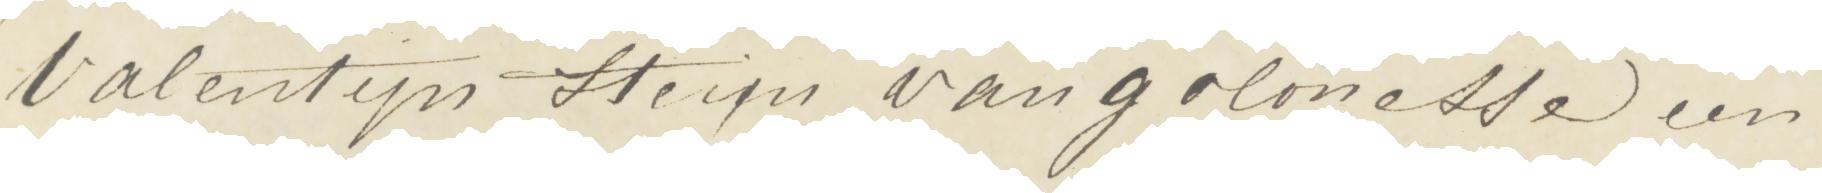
valentijn steijn van golonesse een
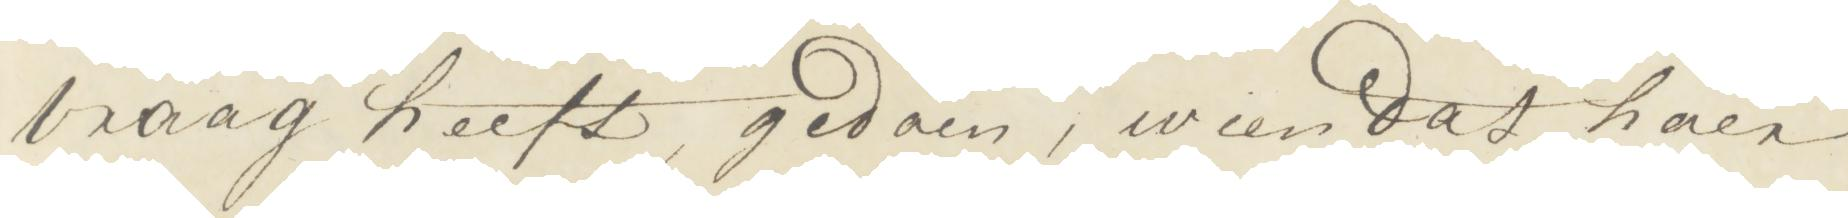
vraag heeft gedaen, wien dat haer
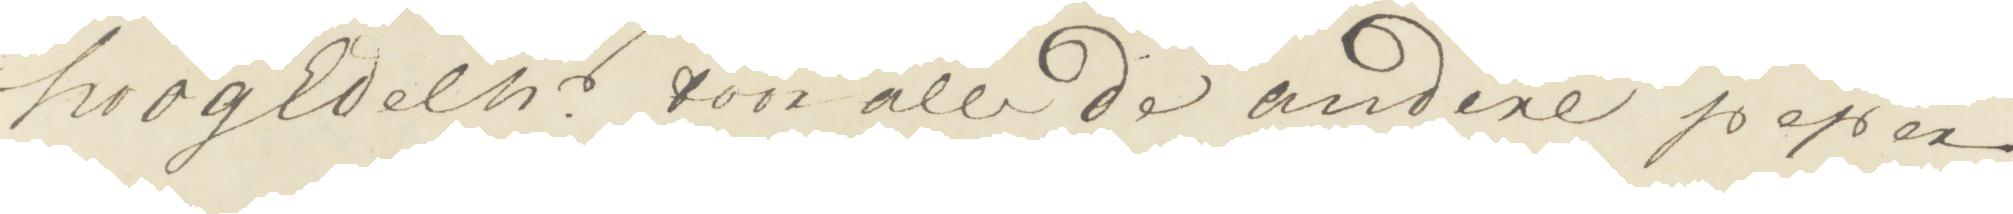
hoogEdelh:s door alle de andere peper
